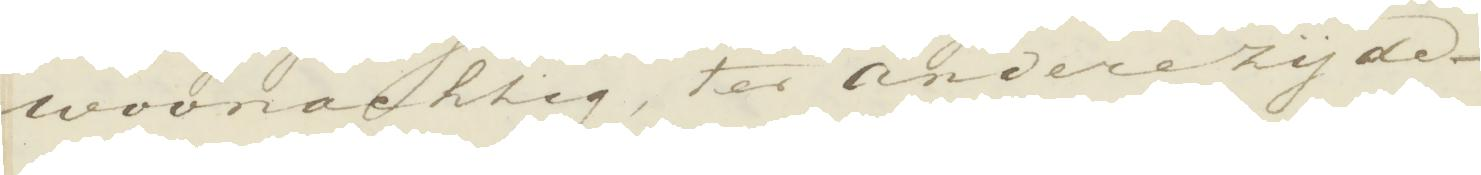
woonachtig, ter andere zijde. —
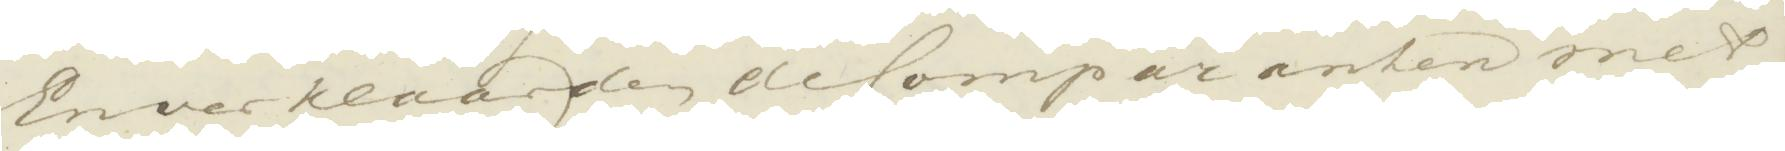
En verklaarden de Comparanten met
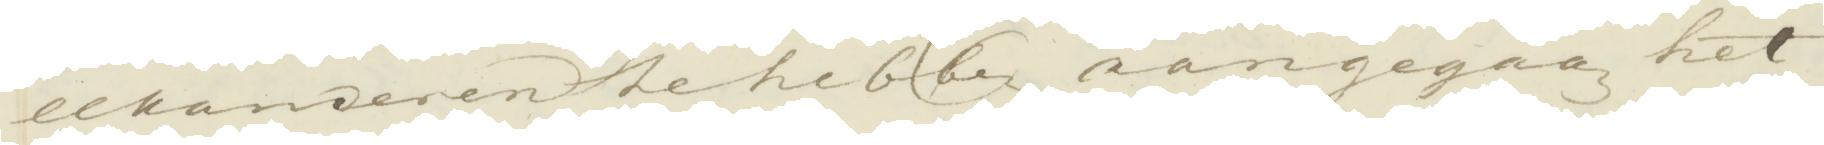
elkanderen te hebben aangegaan het
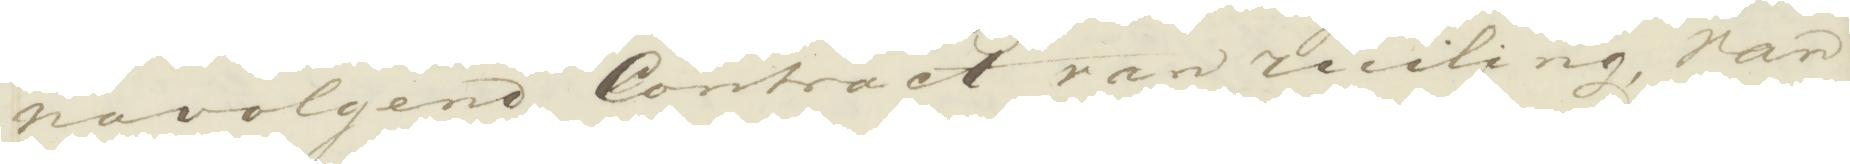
navolgend Contract van ruiling, van
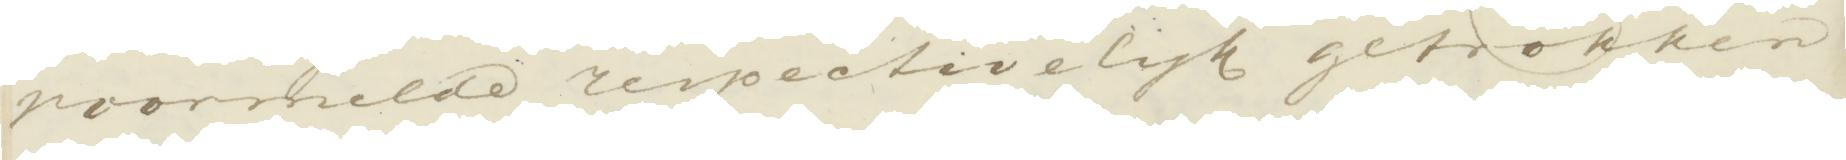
voormelde respectivelijk getrokken
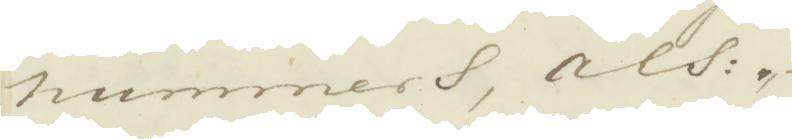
Nummers, als: „
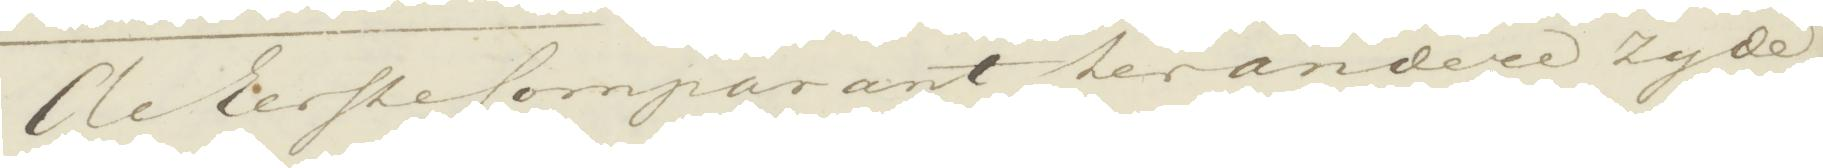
De Eerste Comparant ter andere zyde
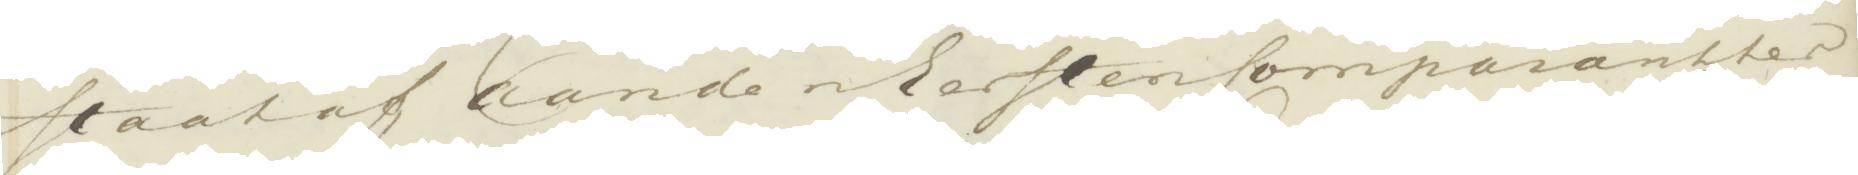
staat af aan den Eersten Comparant ter
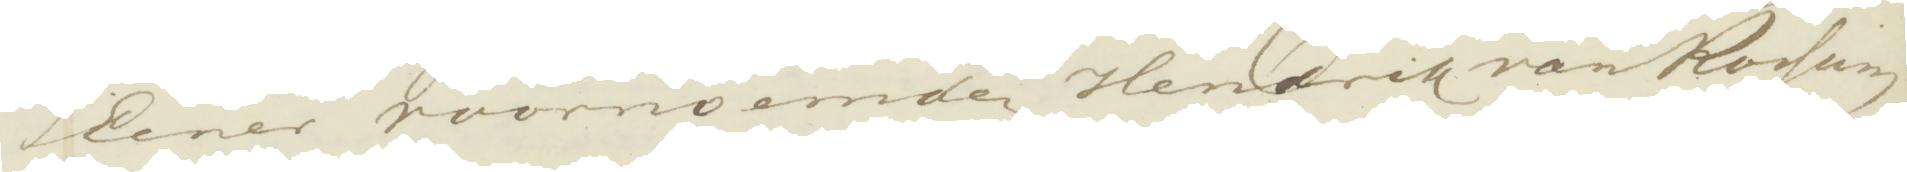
Eener voornoemden Hendrik van Rossum
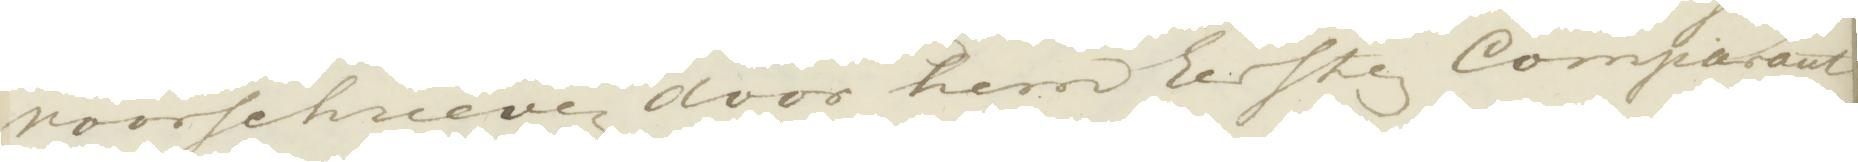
voorschreeven door hem Eerste Comparant
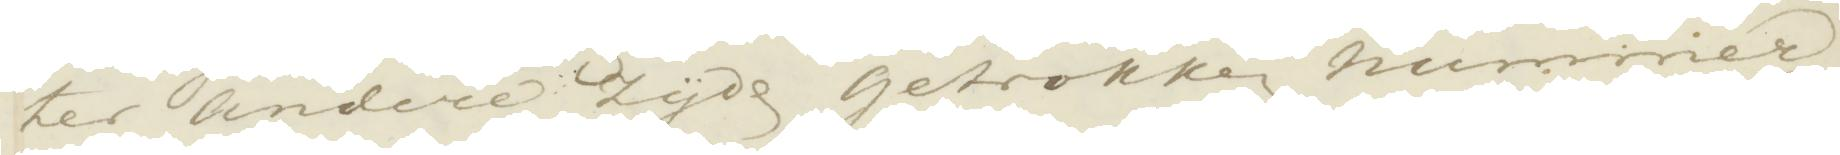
ter andere zijde Getrokken Nummer
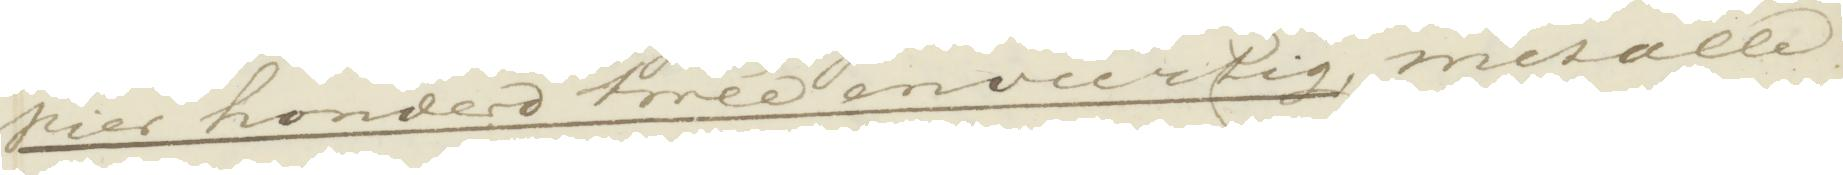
vier honderd twee enveertig, met alle
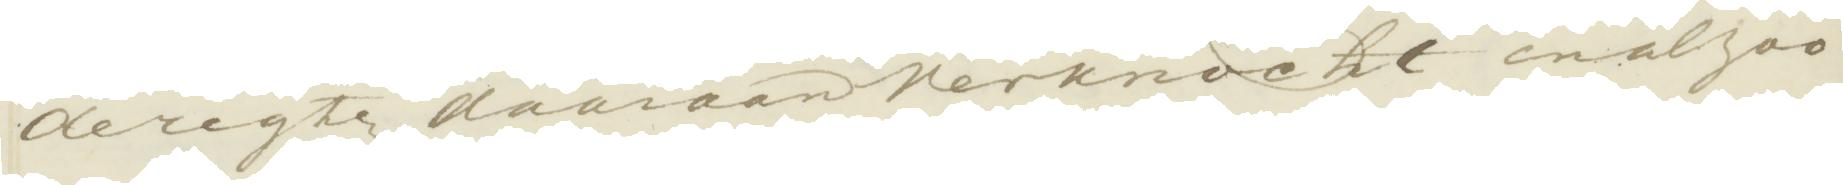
de regten daaraan verknocht en alzoo
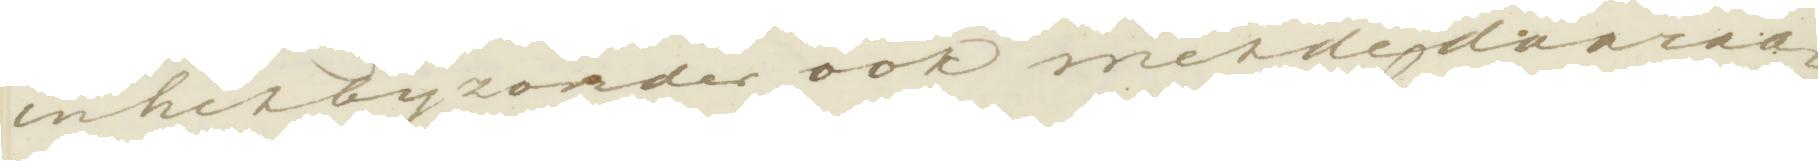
in het byzonder ook met de daaraan
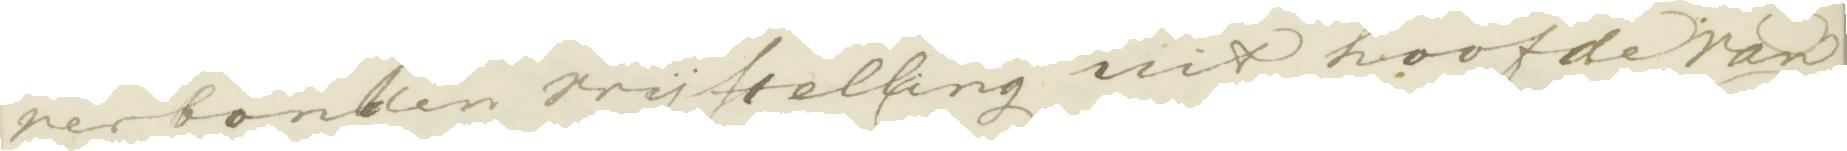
verbonden vrijstelling uit hoofde van
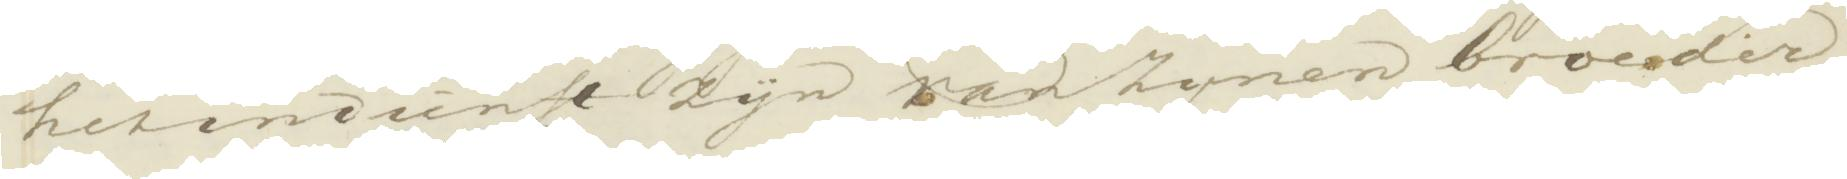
het in dienst zijn van zynen broeder
